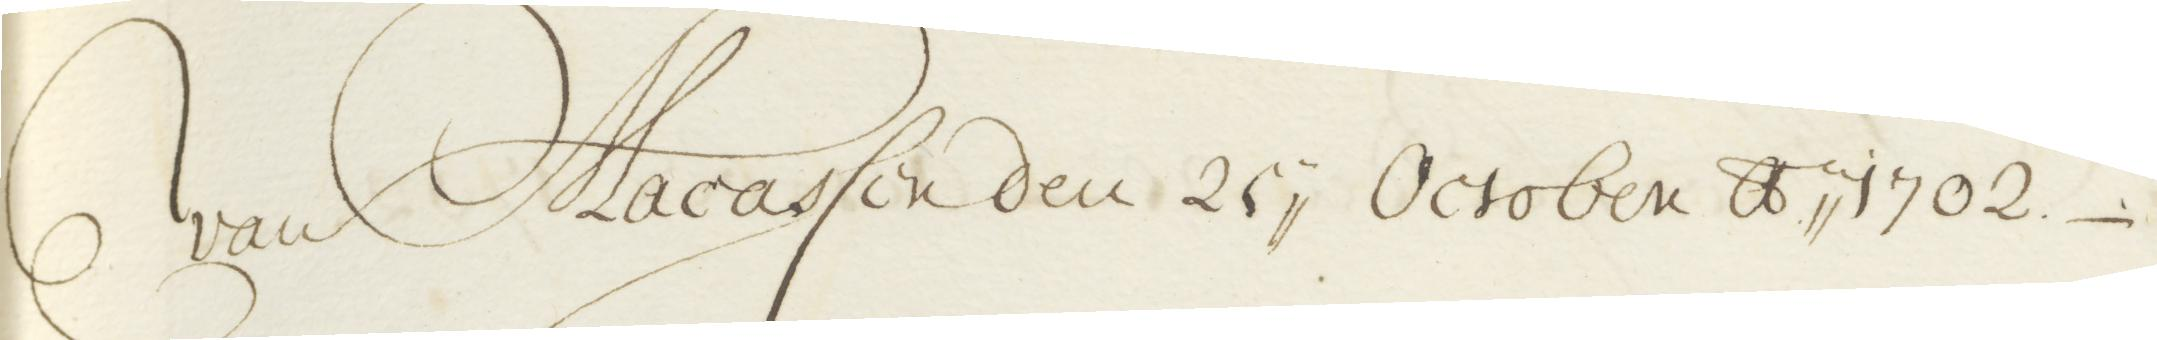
van Macasser den 25„ October A„' 1702.—:
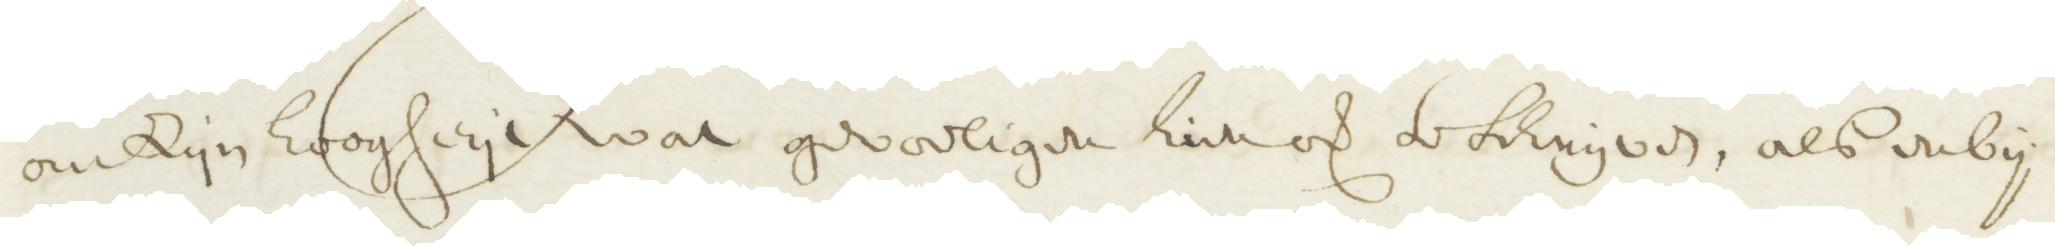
om Zijn hoogheijt wat gevoeliger hier over te schrijven, als erbij
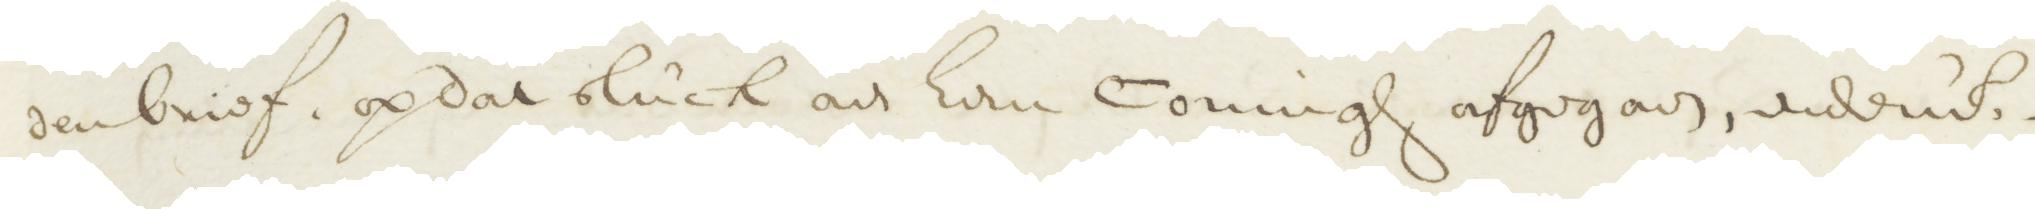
den brief, op dat stuck aen hem Coningh afgegaen, ende uE.
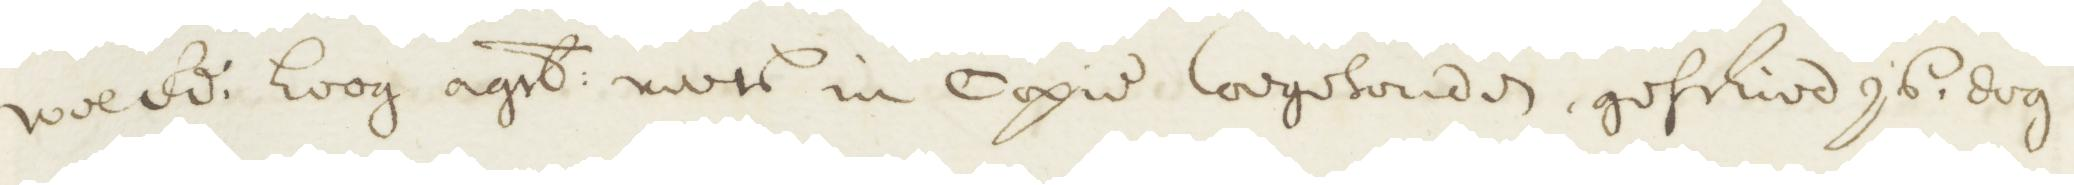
wel Ed: hoog agtb: reets in Copie toegesonden, geschied js, dog
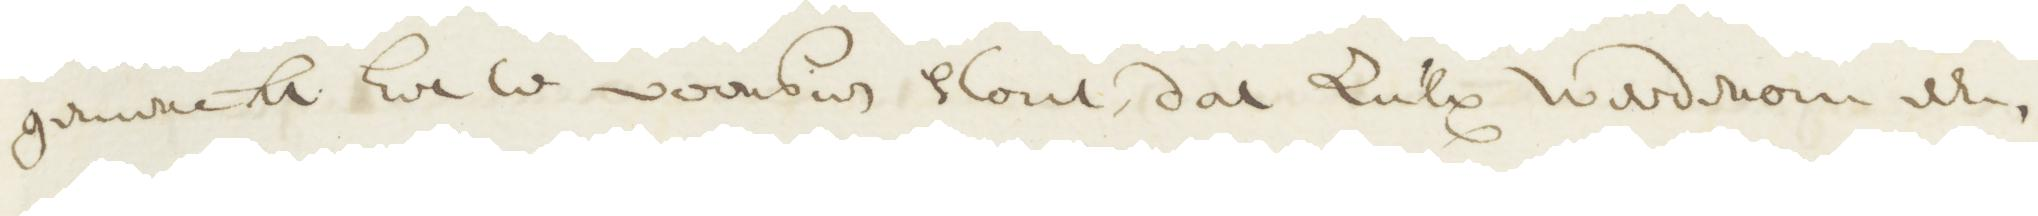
gemerckt: het te voorsien stont, dat Zulx weederom een,
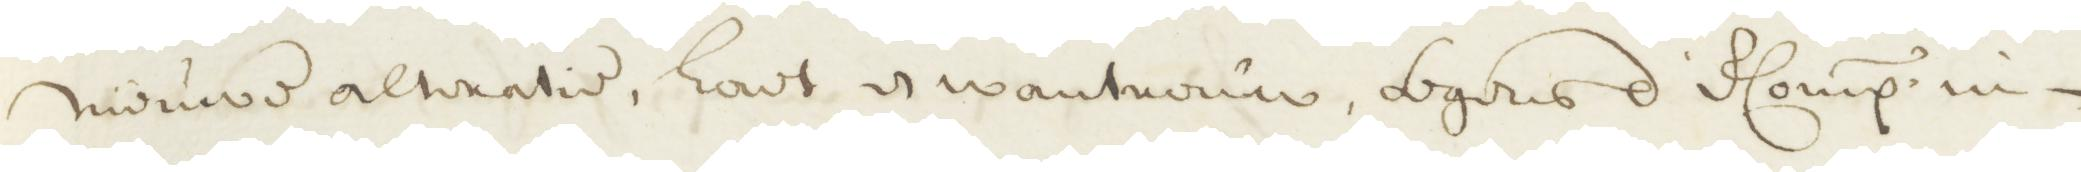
nieuwe alteratie, haet en wantrouw, tegens d’ EComp:e in
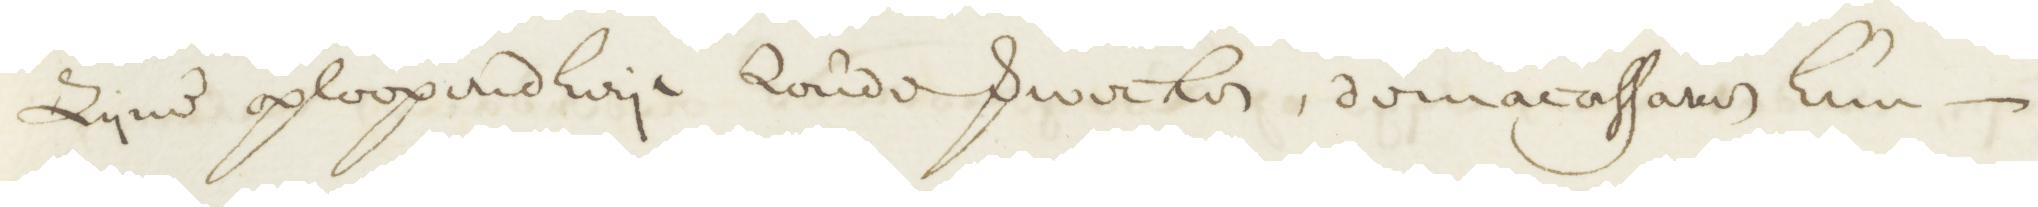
Zijne oploopendheijt Zoude verwecken, de macassaren hun —
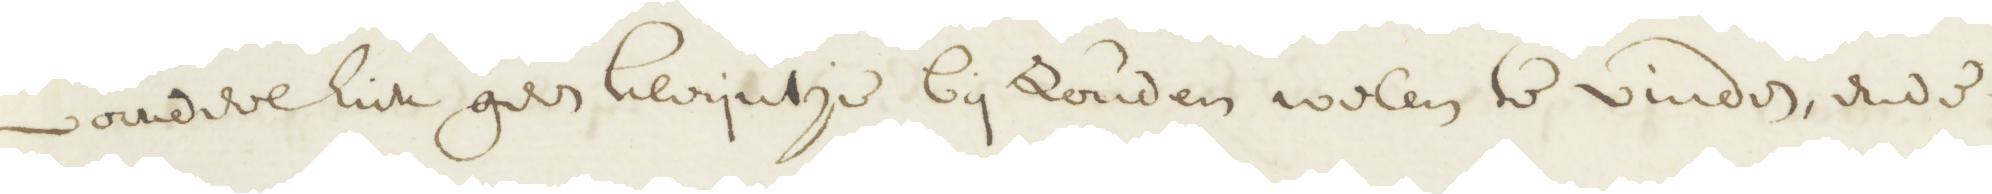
voordeel hier geen kleijntje bij Zouden weten te vinden, ende
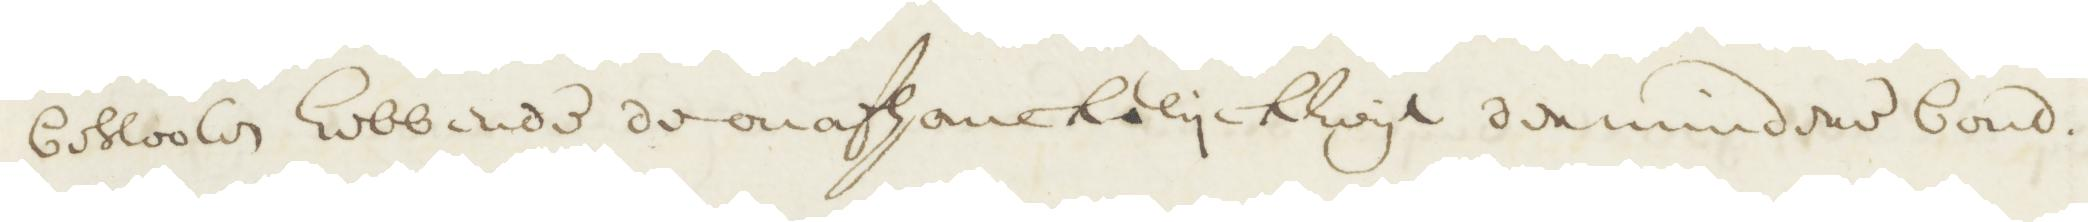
beslooten hebbende de onafhanckelijckheijt der mindere bond.
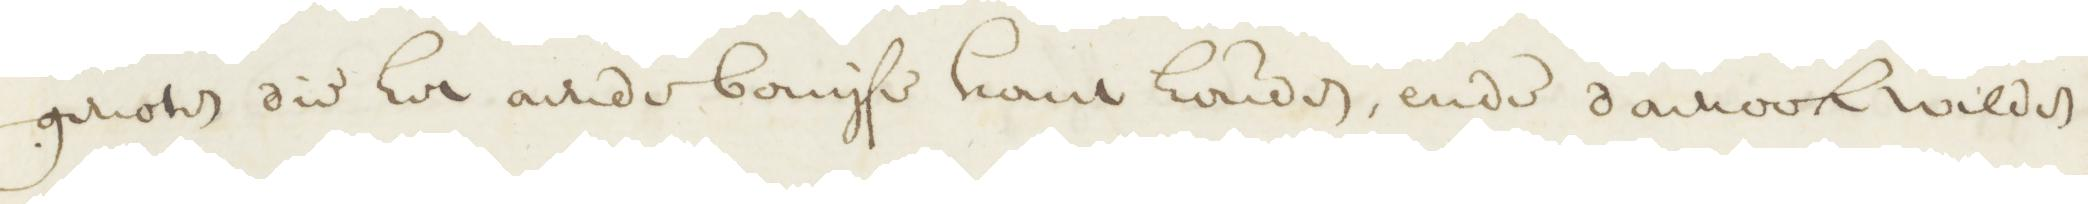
genoten die het aen de bonijse kant houden, ende daer ook wilden
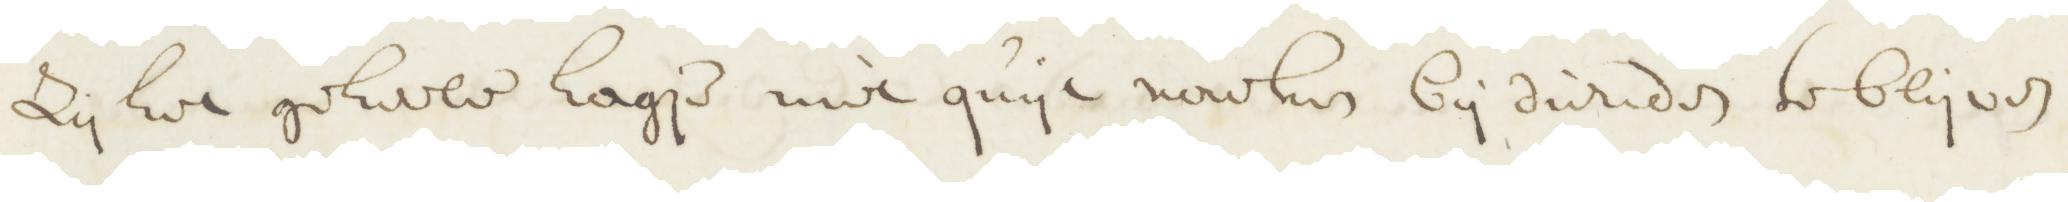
Zij het geheele hagje niet quijt raeken bij dienden te blijven
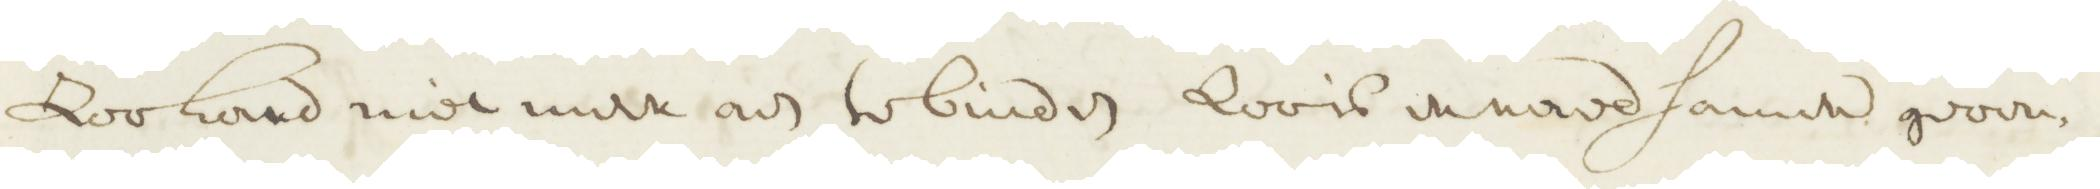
Zoo hard niet meer aen te binden Zoo is er raedsamer geoor,
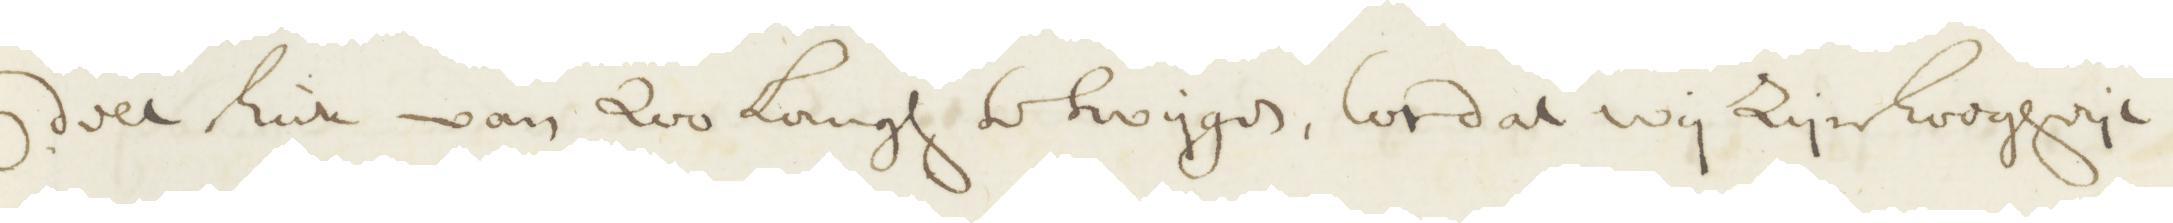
delt hier van Zoo Langh te swijgen, tot dat wij Zijn hoogheijt
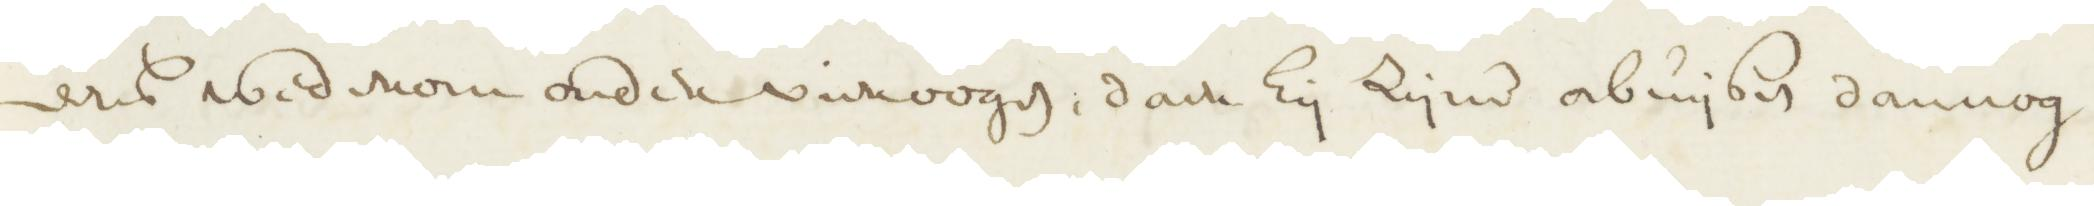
eens wederom onder vier oogen; daer hij Zijne abuijsen dan nog
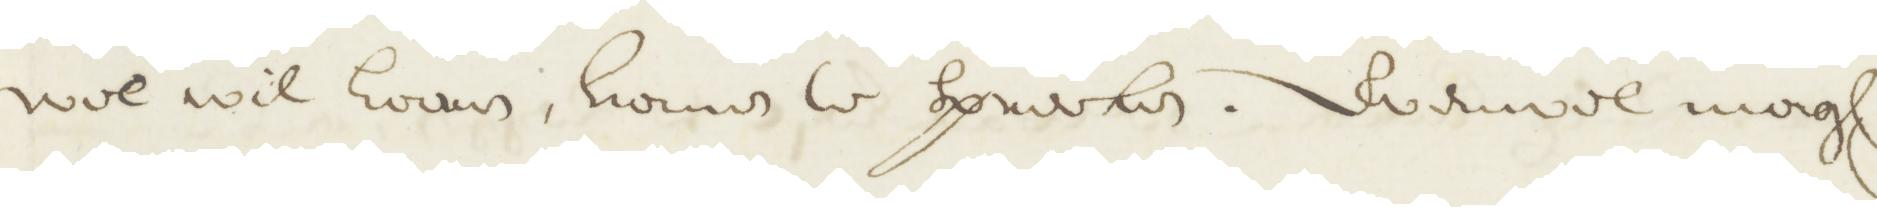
wel wil horen; komen te spreeken. Evenwel magh
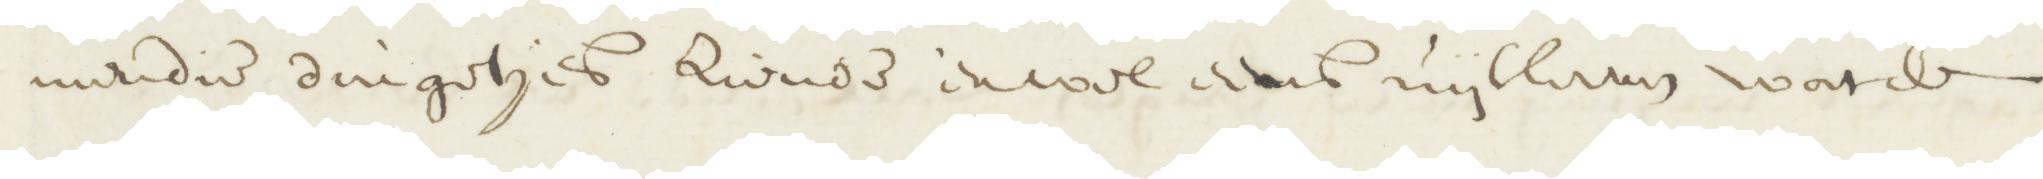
men die dingetjes Ziende er wel eens uijtleren wat de
